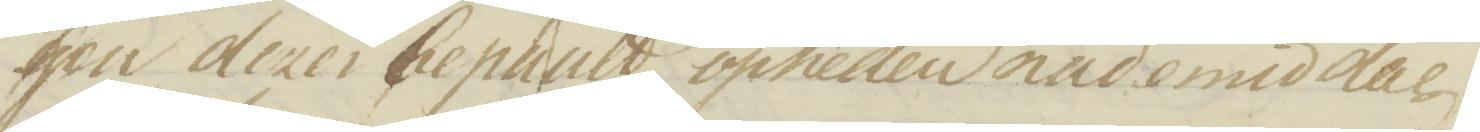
gen dezer bepaald op heden nade middach
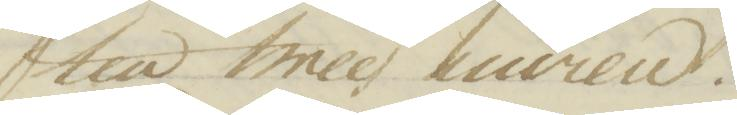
ten twee uuren.
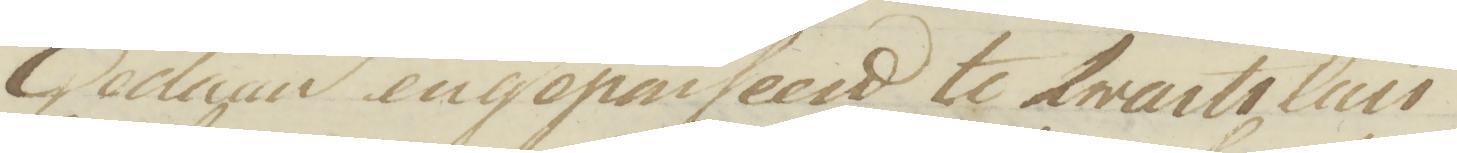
Gedaan en gepasseerd te Zwartsluis
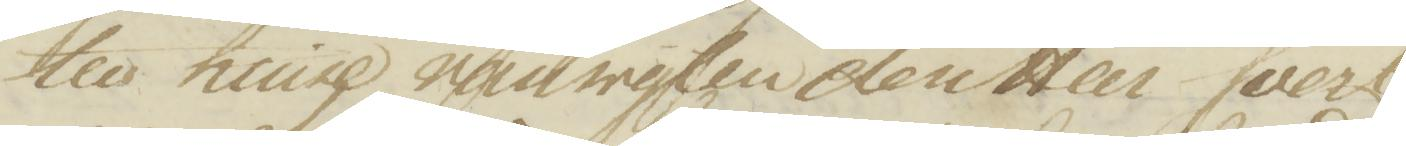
ten huize van wijlen den Heer Coert
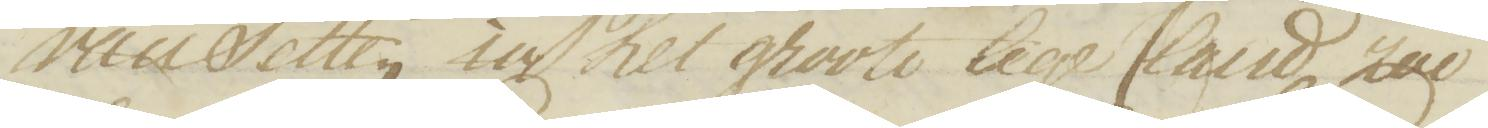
van Setten in het groote lege land zoo
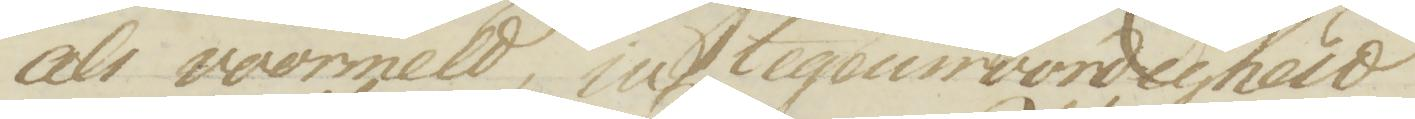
als voormeld, in tegenwoordigheid
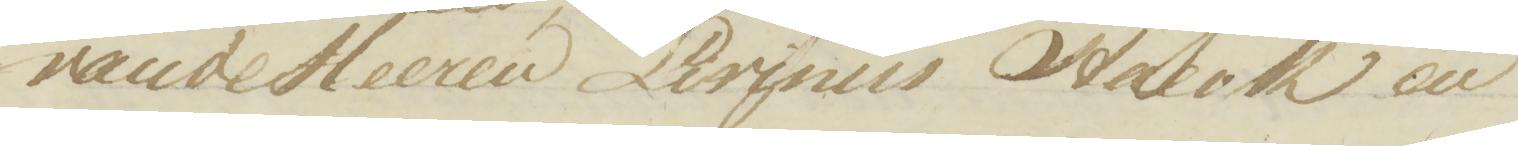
vande Heeren Levinus Haeck en
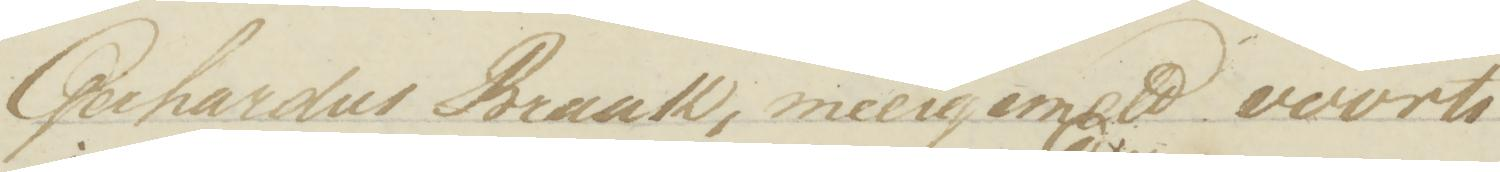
Gerhardus Braak, meergemeld voorts
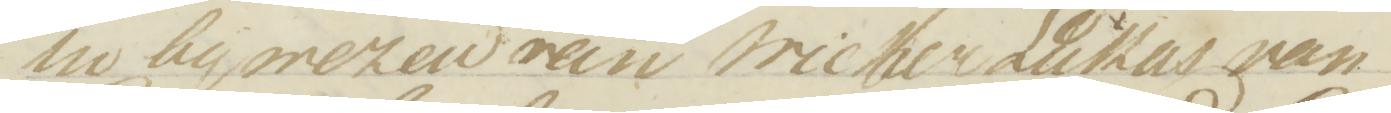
in by wezen van Wicher Lukas van
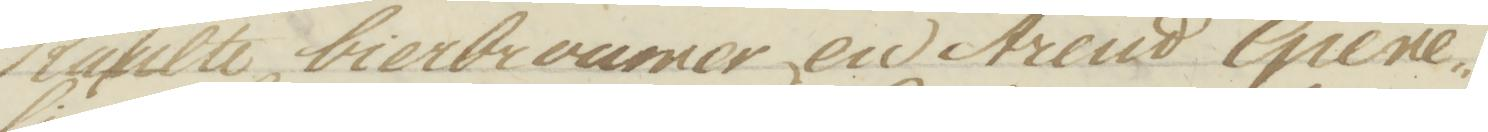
Raalte bierbrouwer en Arend Greve„
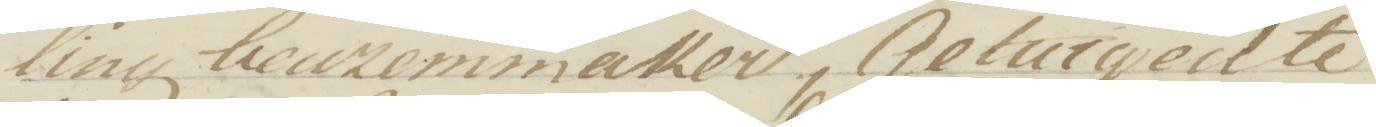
ling beuzemmaker, Getuigen te
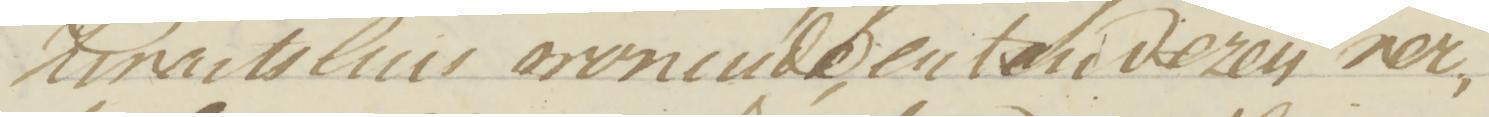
Zwartsluis wonende en ten dezen ver„
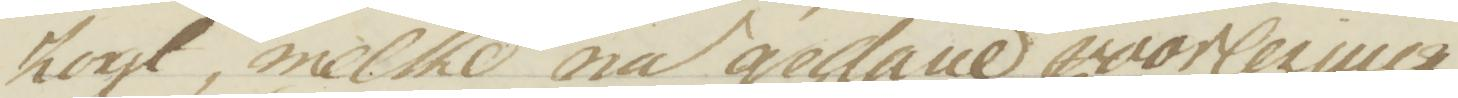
zogt welke na gedane voorlezing
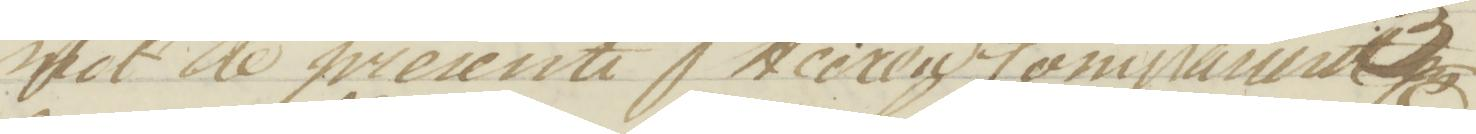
met de presente Heeren Comparenten
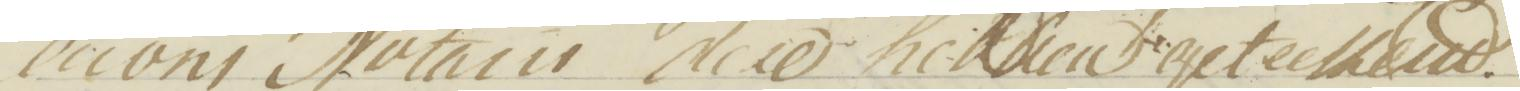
en ons Notaris deze hebben geteekend.
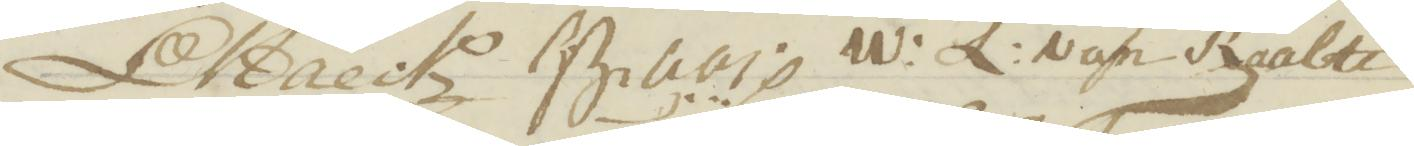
LHaeck Braak W: L: van Raalte
